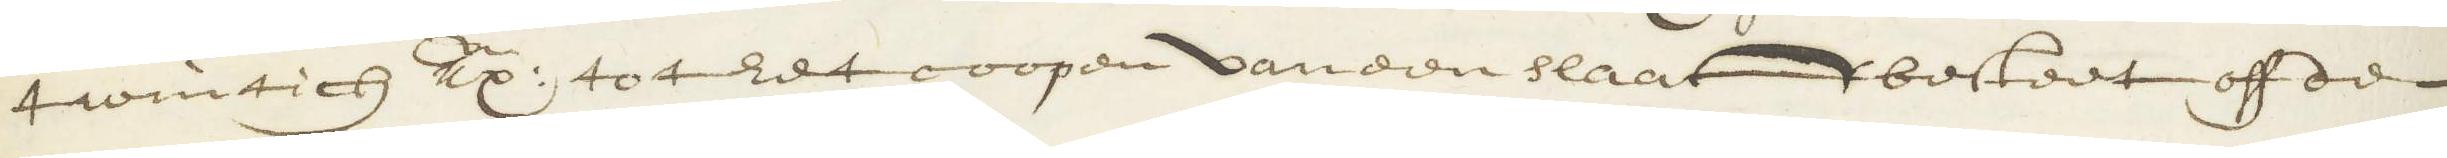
twintich rx: tot het coopen van een slaaff besteet off de
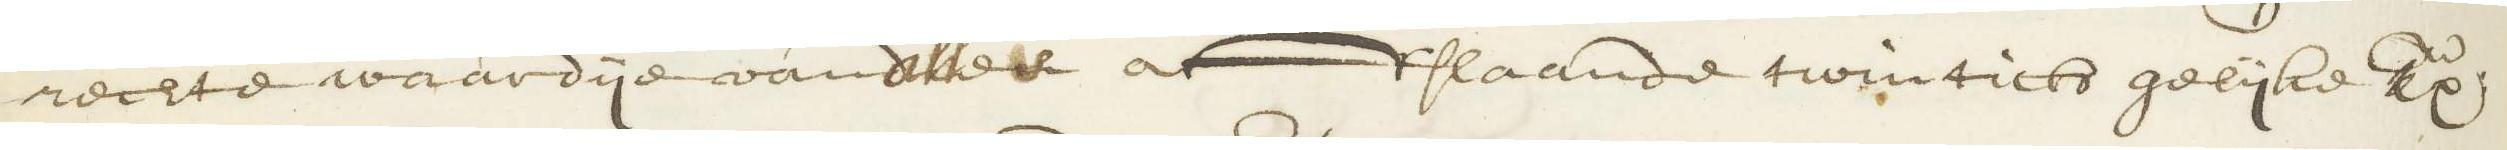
rechte waardije van deses affslaande twintich gelijke rx:
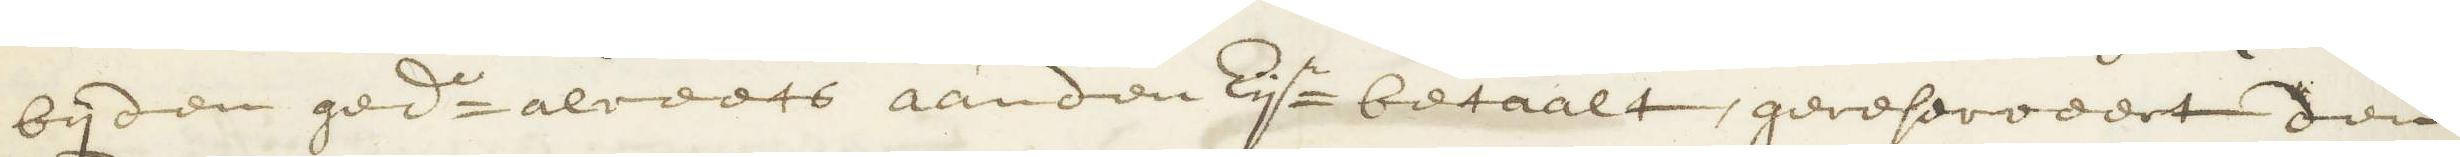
bij den ged=e alreets aan den Eij=r betaalt, gereserveert den
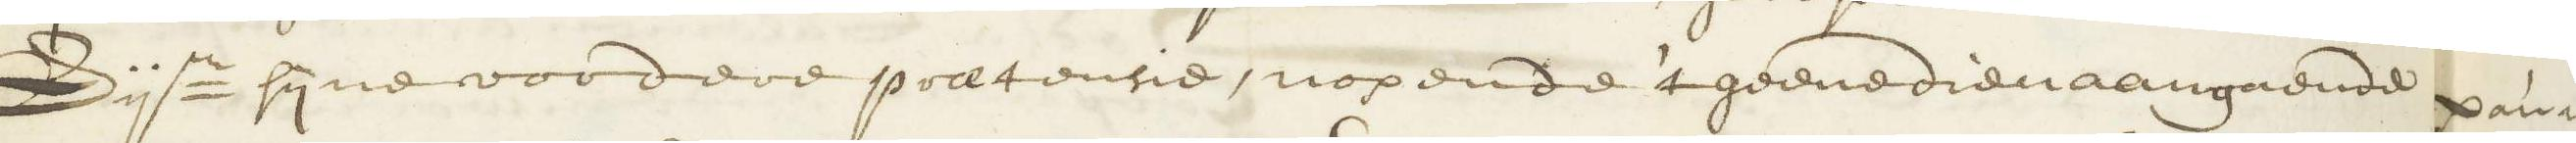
Eij=r sijne vordere pretensie, nopende ’t geene dienaangaende
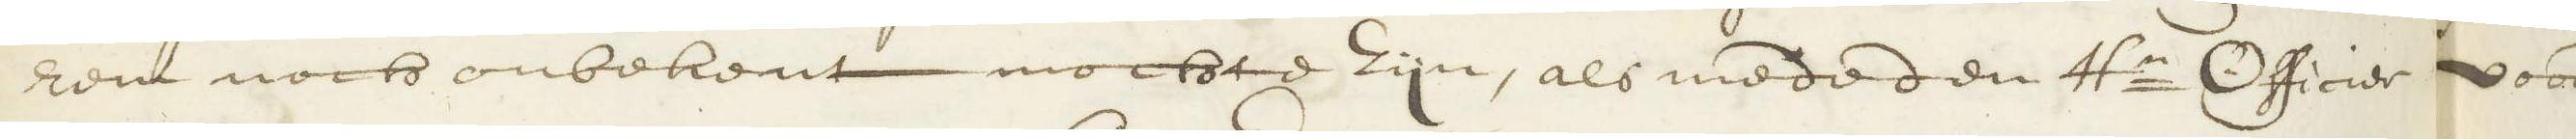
hem noch onbekent mochte zijn, als mede den H=r Officier
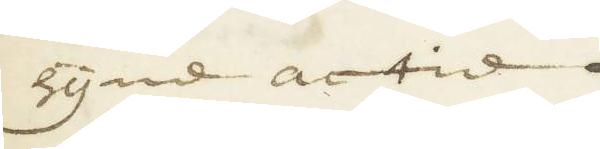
zijne actie
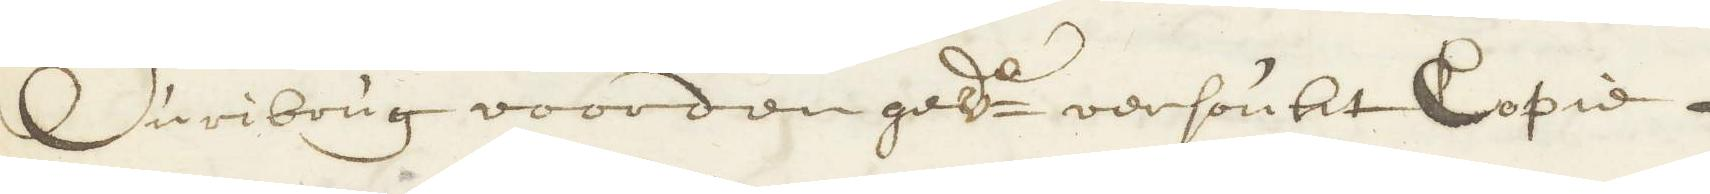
Duribrug voorden ged=e versoukt Copie
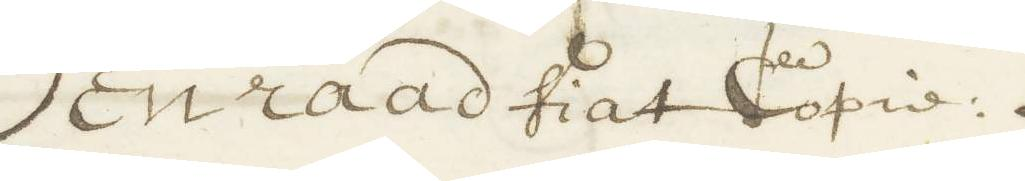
Den raad fiat Copie:
